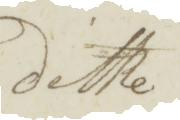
dikke
